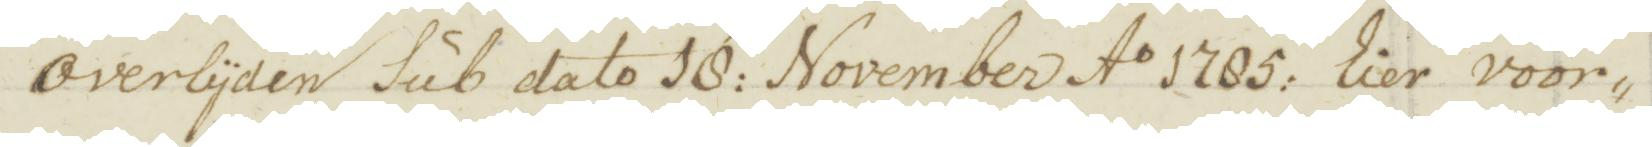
overlijden sub dato 18: November Ao 1785. hier voor„
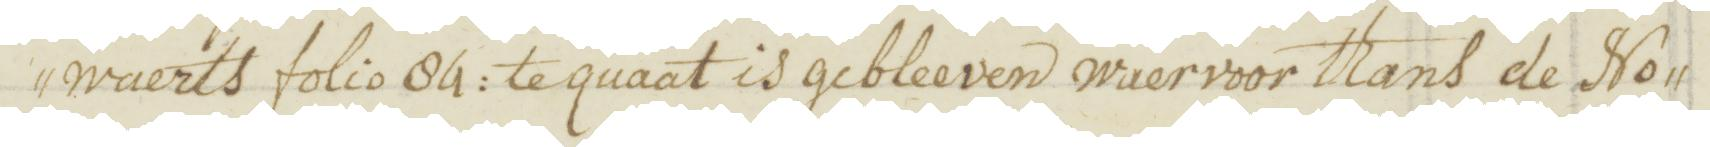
„waerts folio 84: te quaat is gebleeven waer voor thans de No„
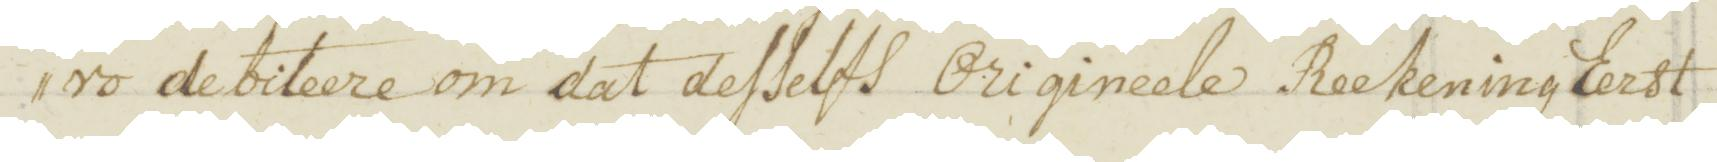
„vo debiteere om dat desselfs Origineele Reekening Eerst
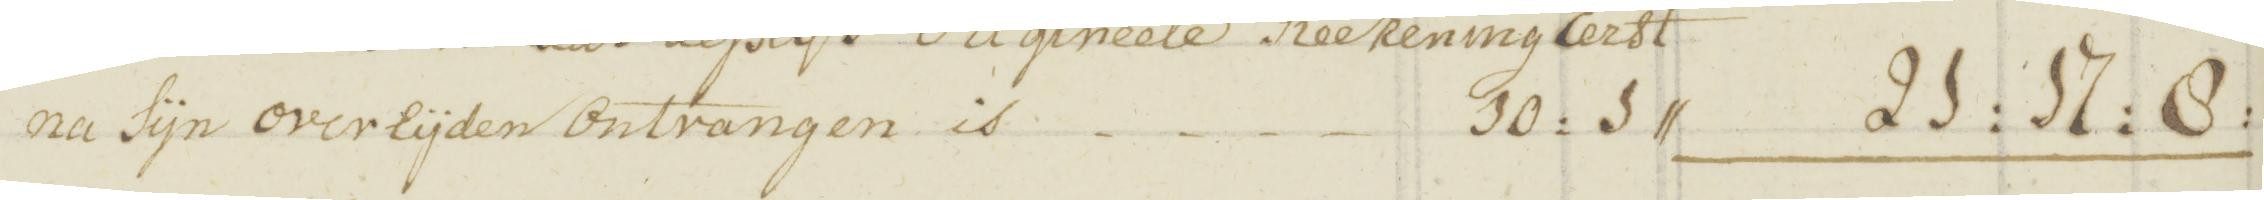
na sijn overlijden ontvangen is - - - - 10: 1„ 21:17:8.
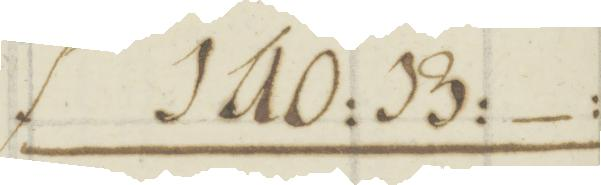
ƒ 140:13: -— :
